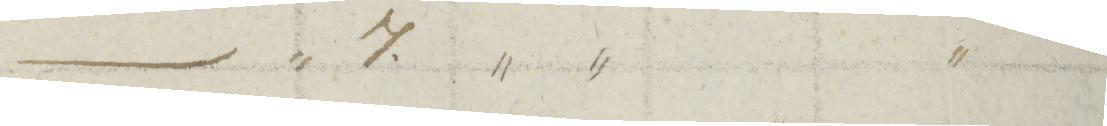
— „ 7. „ „ „
